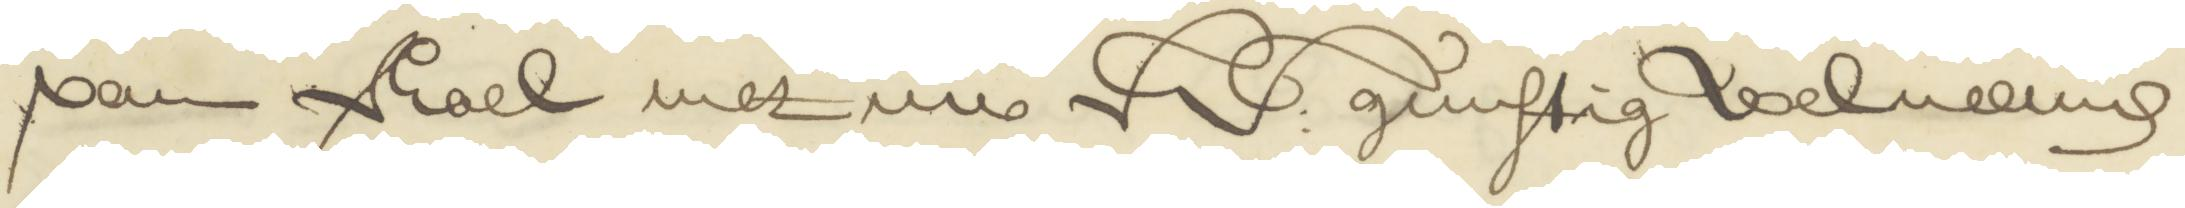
van verhael met uw EE: gunstig welneemen
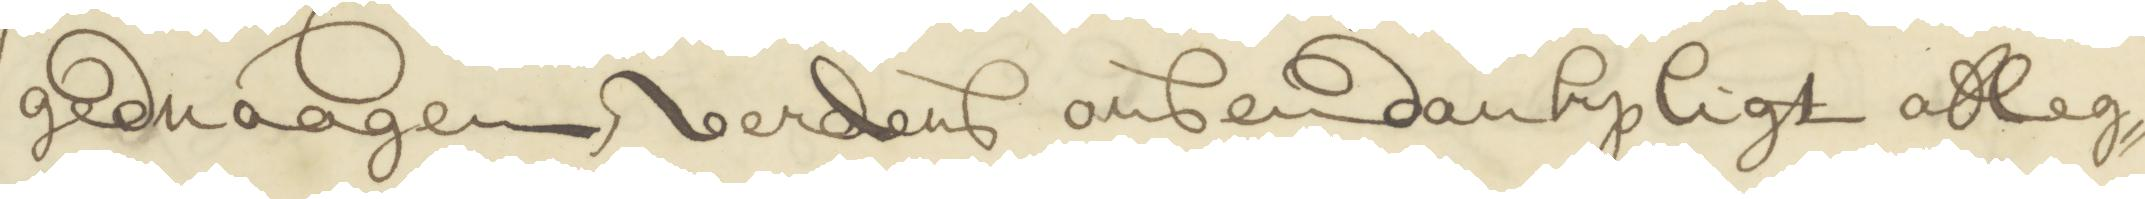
gedraagen verders onsen dankpligt afleg
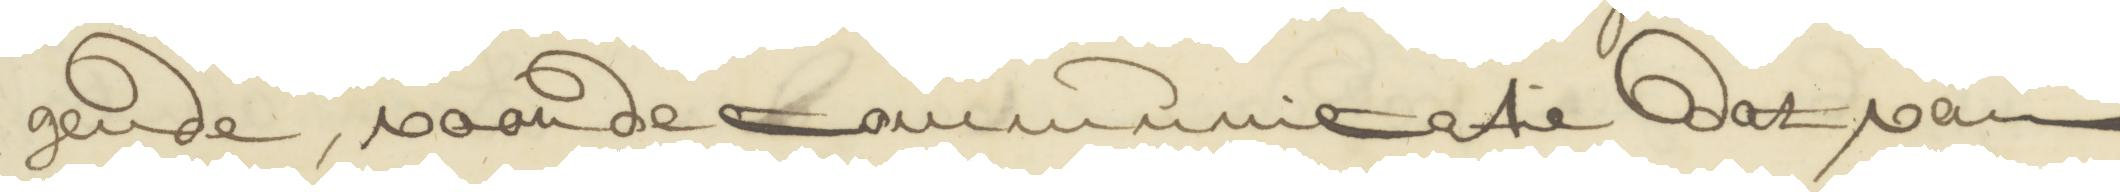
gende, voor de communicatie dat van
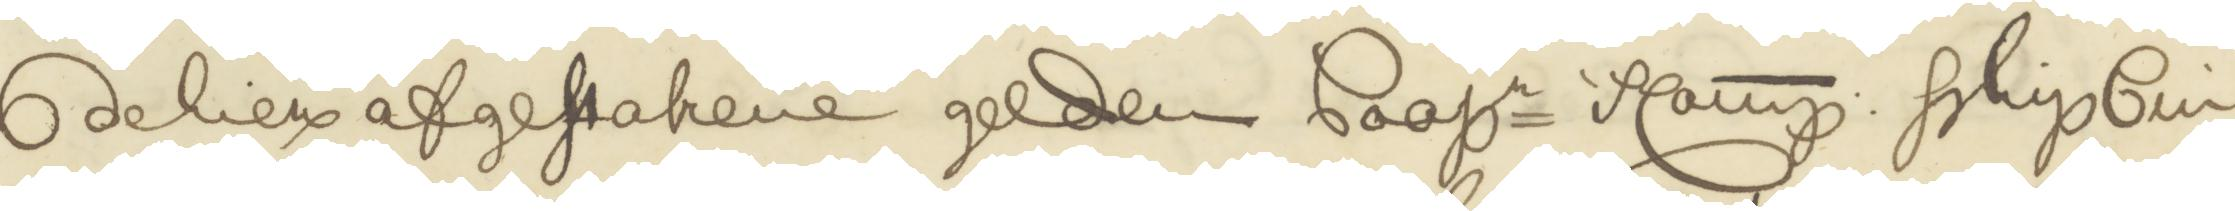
de hier afgestokene gelden soo p=r ’sComp: schip bin
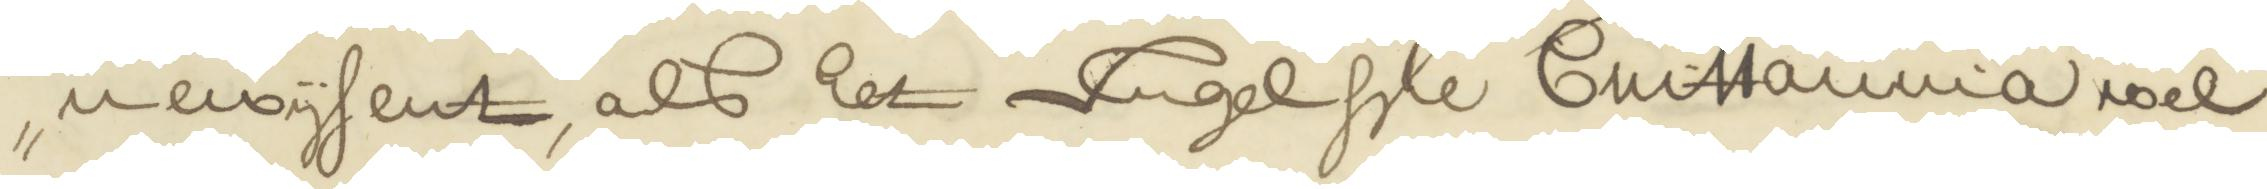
„newijsent, als het Engelsche brittannia wel
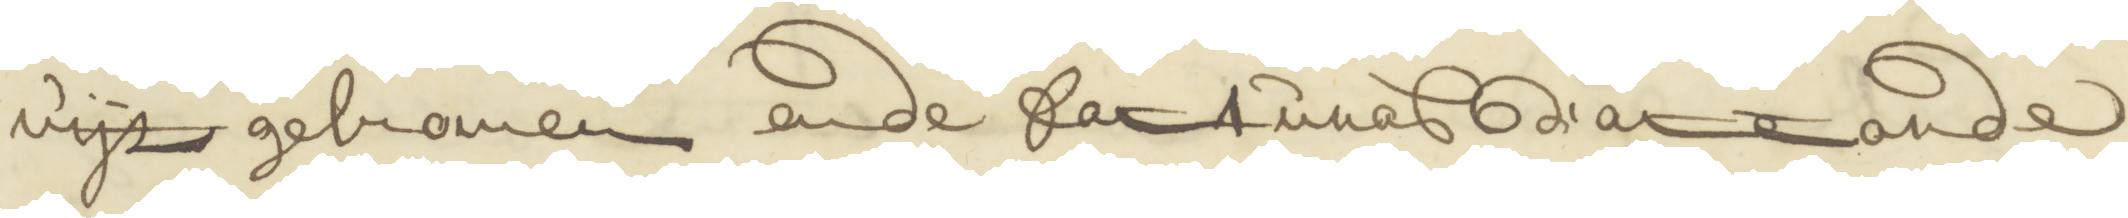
uijt gekomen ende facturas d'accorde
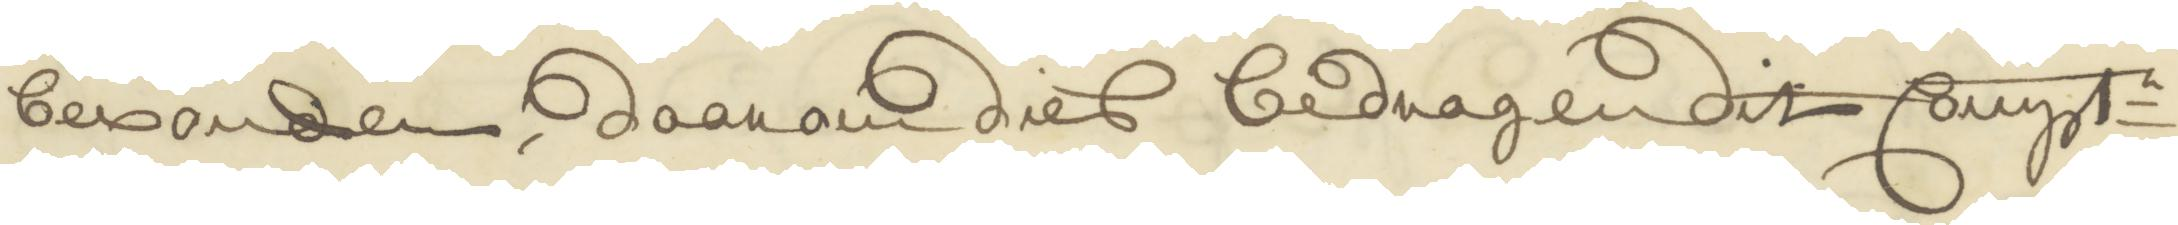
bevonden, daarom dies bedragen dit Compt=r
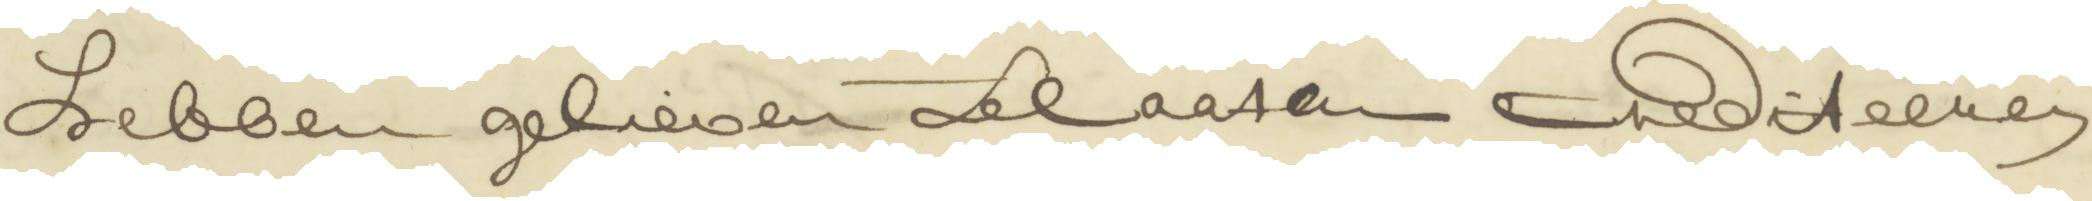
hebben gelieven telaaten crediteeren
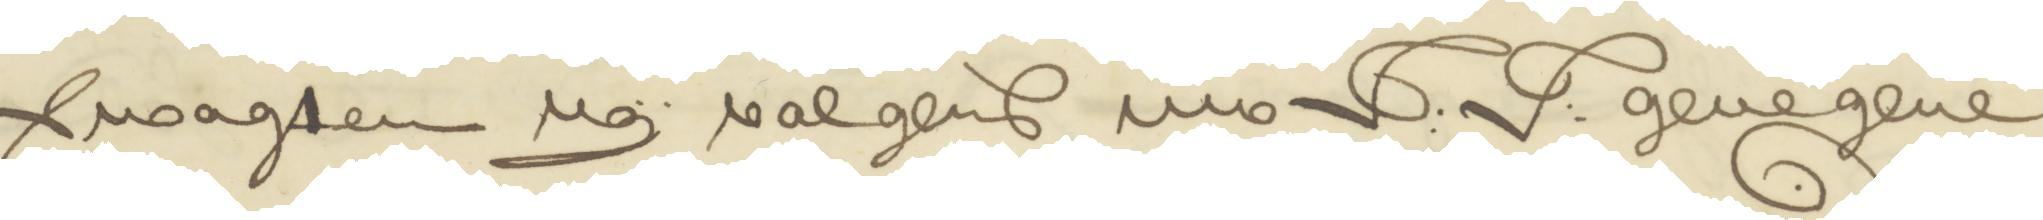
verwagten wij volgens uw E:E: genegene
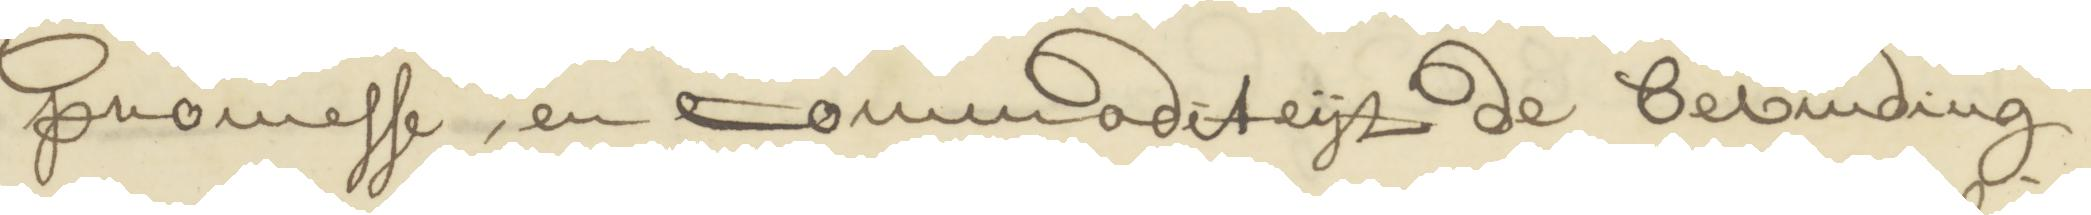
promesse, en commoditeijt de bevinding
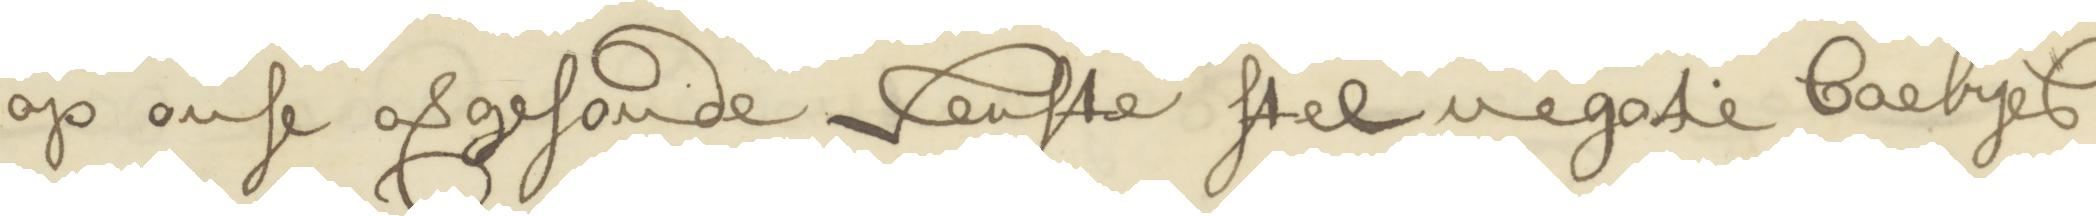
op onse overgesonde Eerste stel negotie boekjes
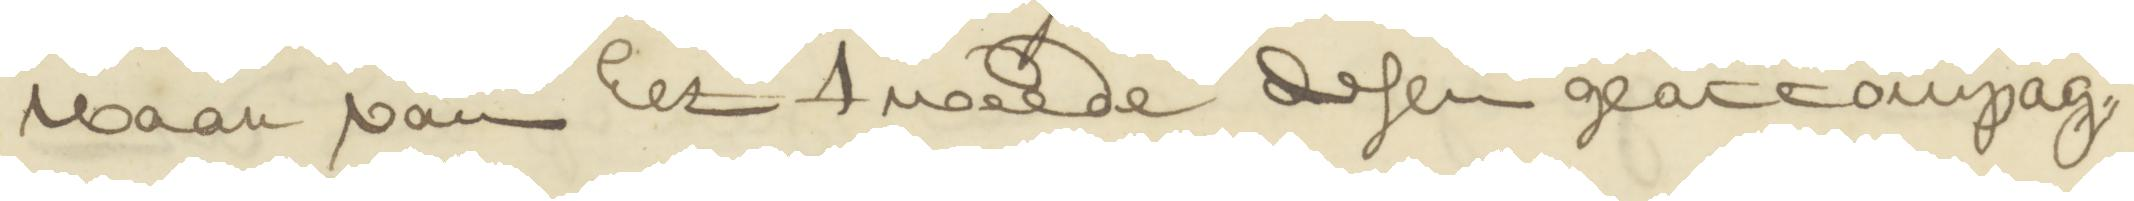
waar van het tweede desen geaccompag„
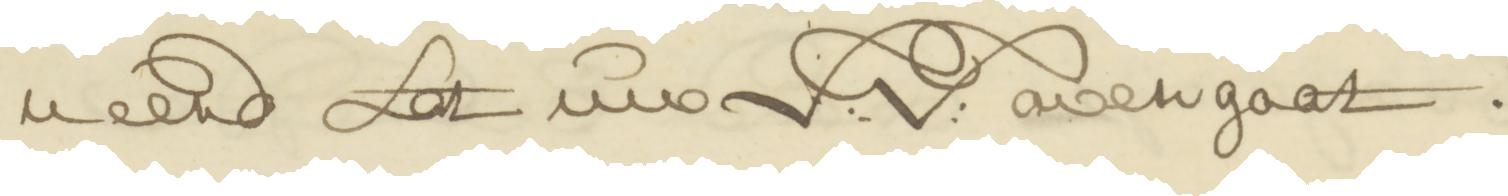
neerd tot uw E:E: over gaat
